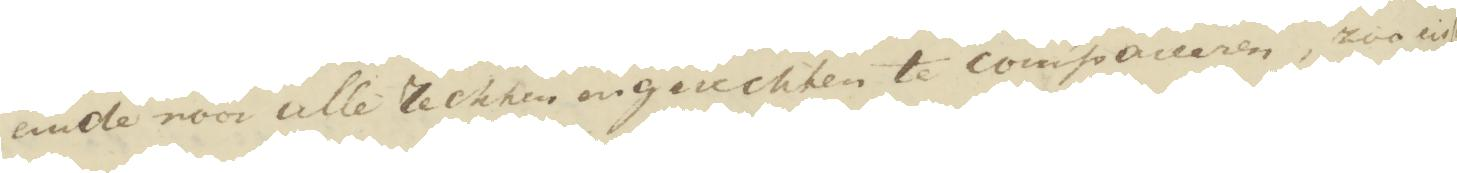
einde voor alle rechten en gerechten te compareeren, zoo eiss
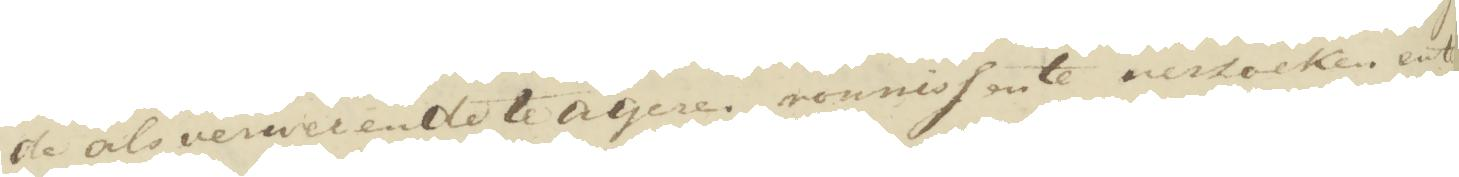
de als verwerende te ageren, vonnissen te versoeken ent
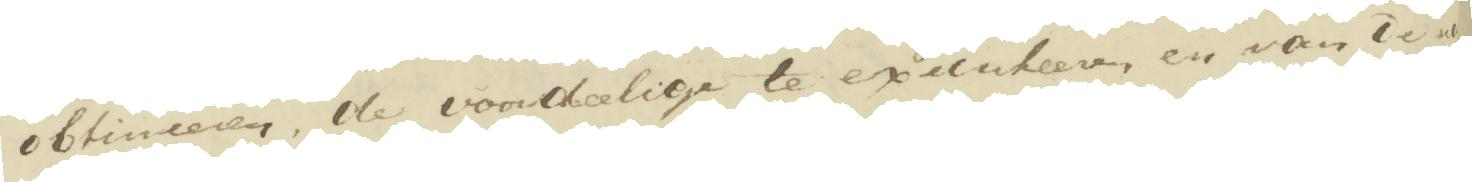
obtineeren, de voordeelige te executeeren, en van te n
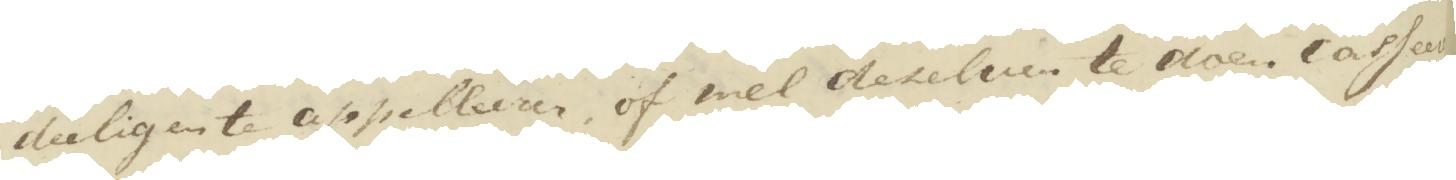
deeligen te appelleeren, of met dezelven te doen casseer
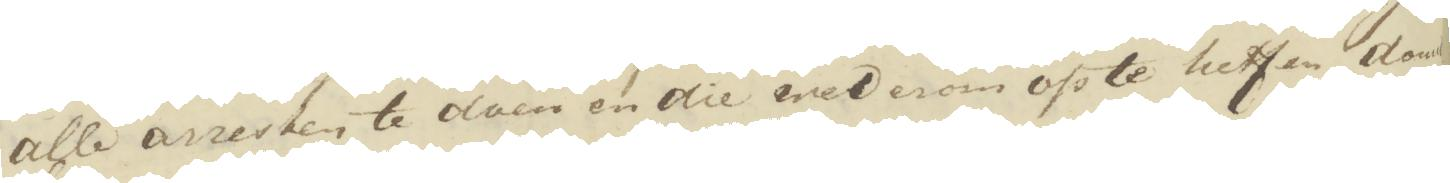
alle arresten te doen en die wederom op te heffen doen
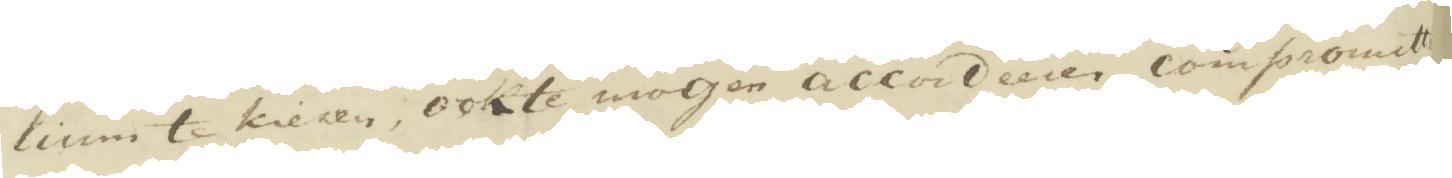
lium te kiezen, ook te mogen accordeeren, compromitt
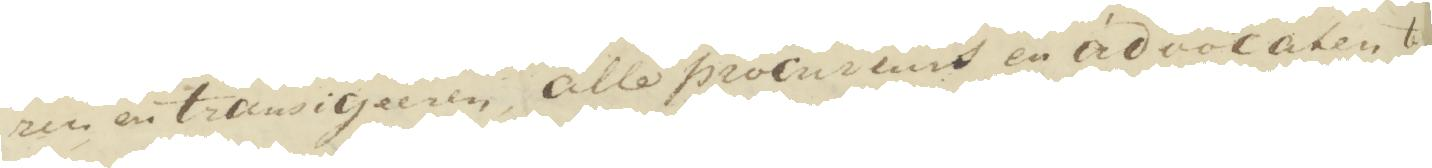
ren en transigeeren, alle procureurs en advocaten te
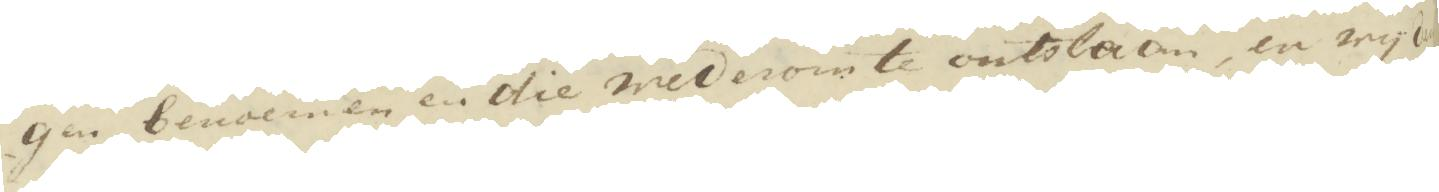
gen benoemen en die wederom te ontslaan , en wijl
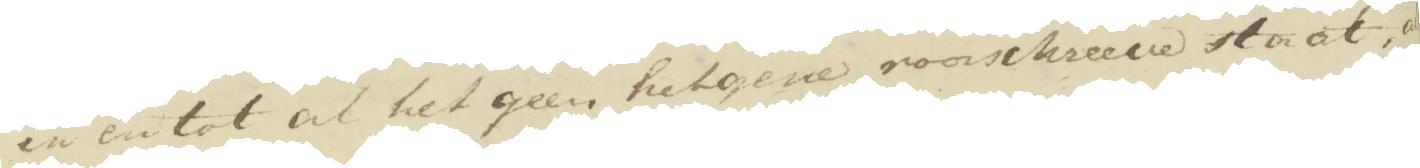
in en tot al het geen hetgene voorschreeve staat,
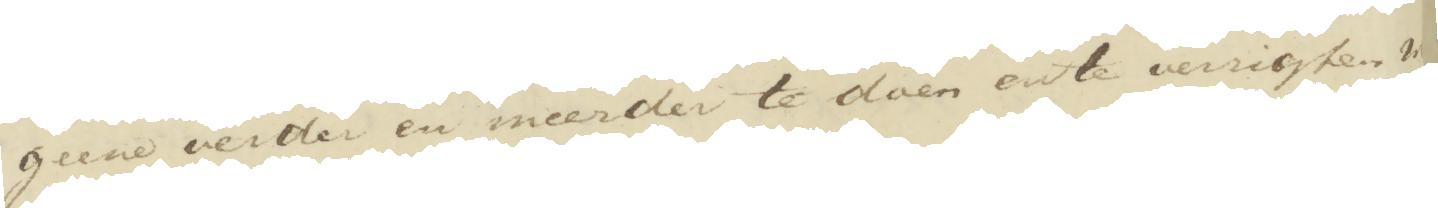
geene verder en meerder te doen en te verrigten w
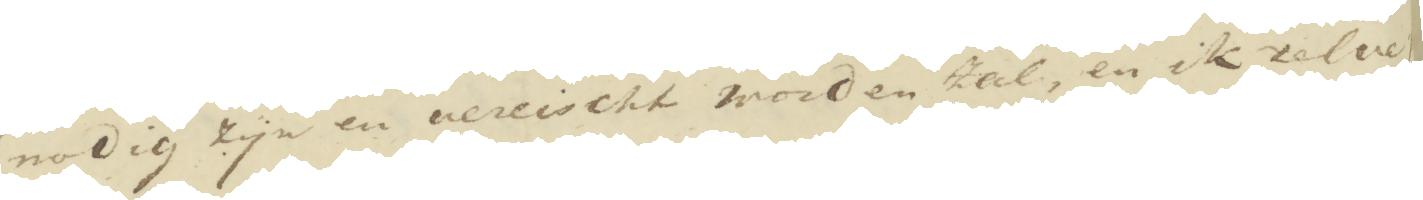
nodig zijn en vereischt worden zal, en ik zelve p
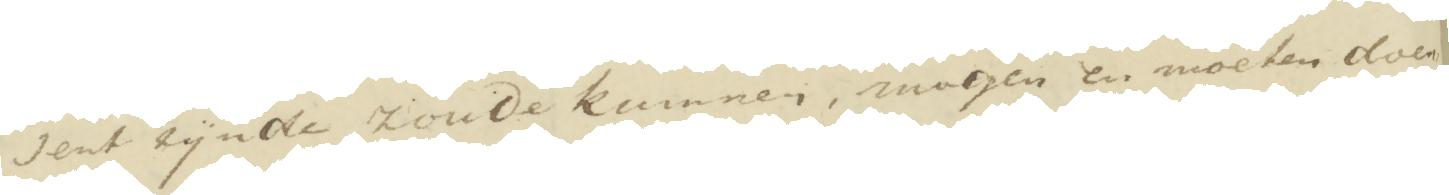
sent zijnde zoude kunnen, mogen en moeten doen
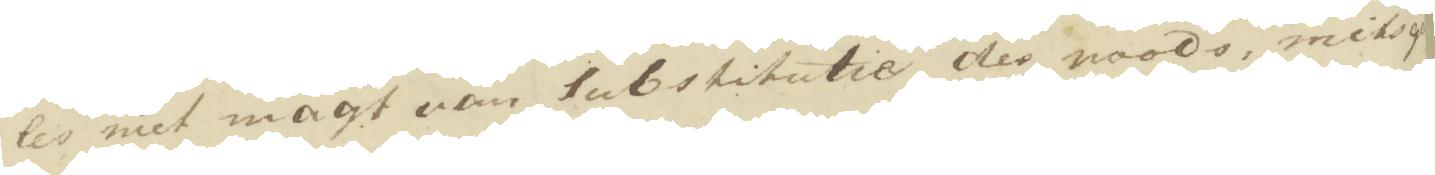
les met magt van substitutie, des noods, mitsg
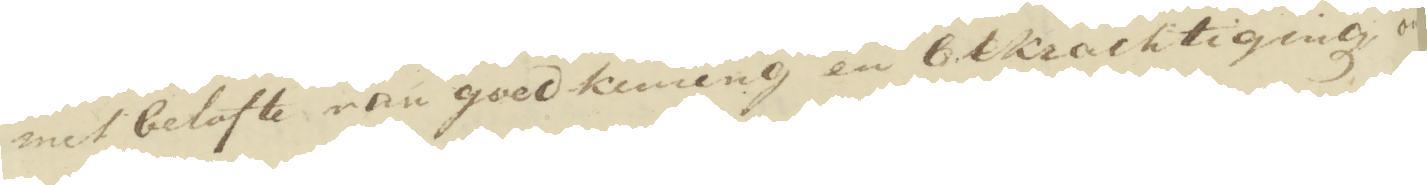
met belofte van goedkeuring en bekrachtiging, o
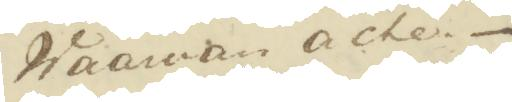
Waarvan acte. —
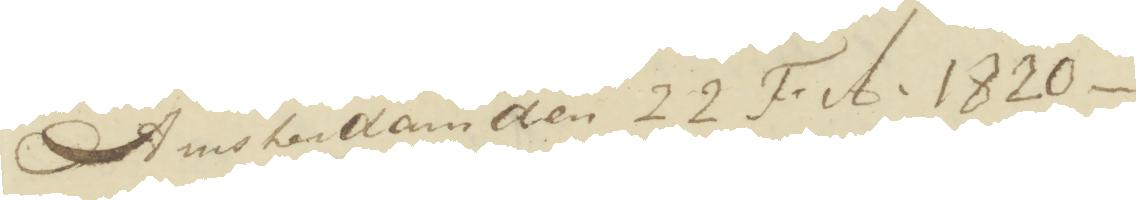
Amsterdam den 22 Feb. 1820-
